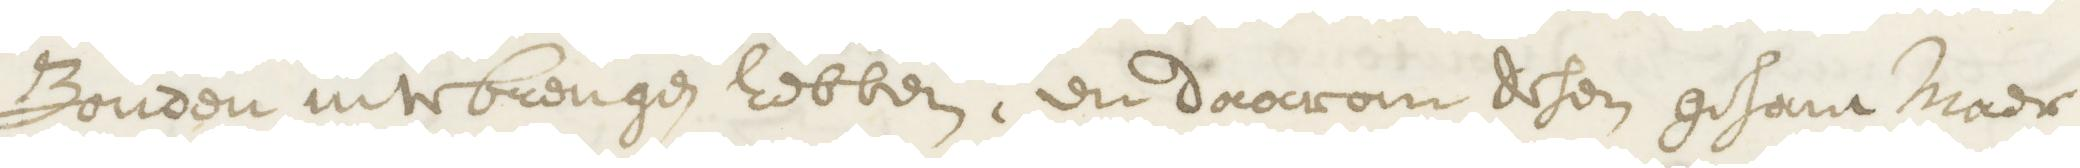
zouden intebrengen hebben, en daarom desen gesant maer
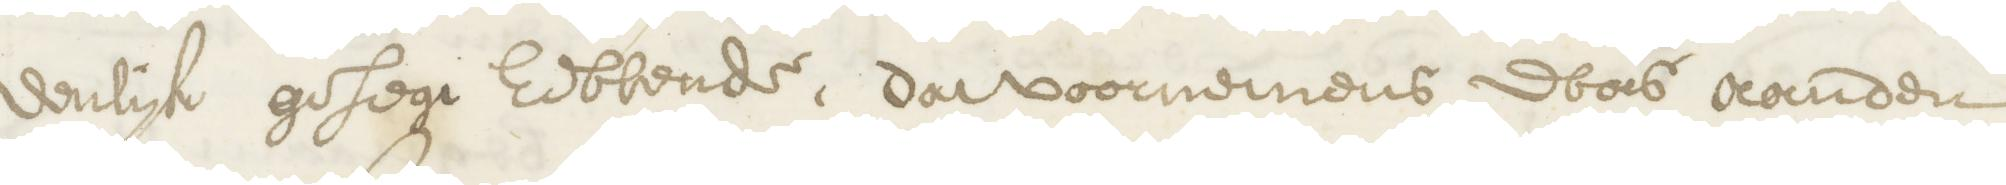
eenlijk gesegt hebbende, dat voornemens was aanden
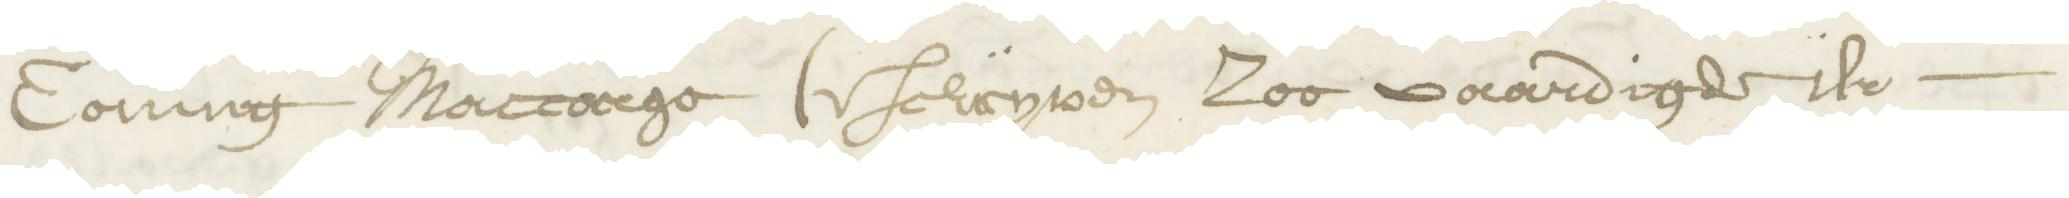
Coning Maccoago teschrijven zoo vaardigde ik —
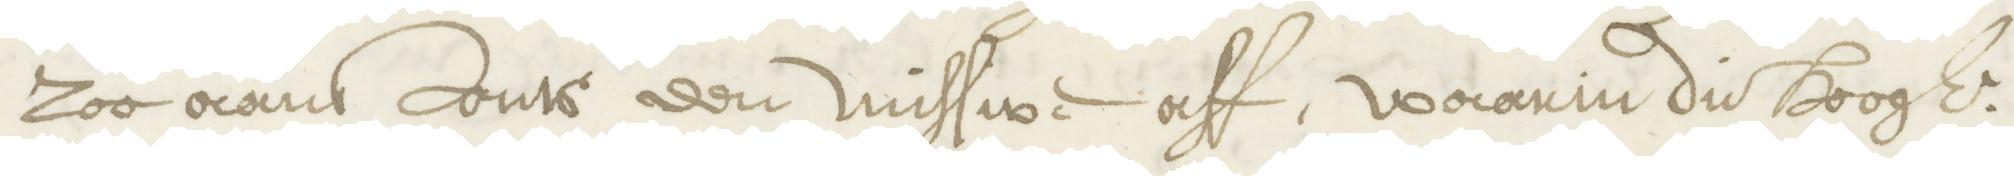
zoo aanstonts een missive aff, waarin die hoogh.t
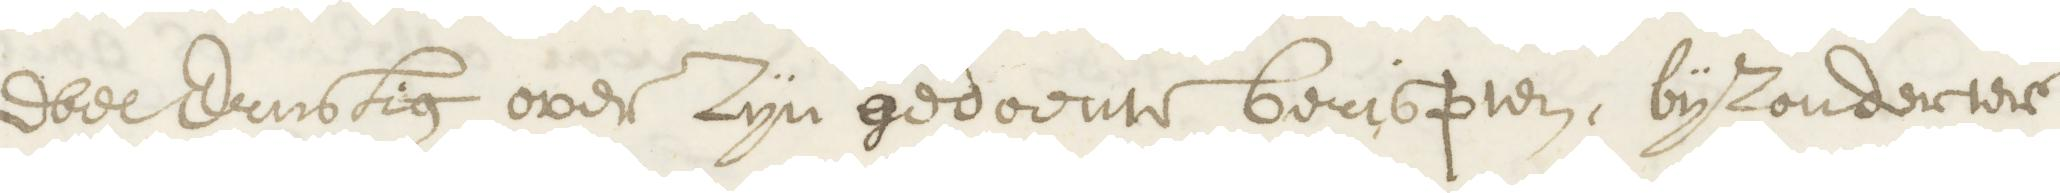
wel Ernstig over zijn gedoente berispten, bij zonder ter
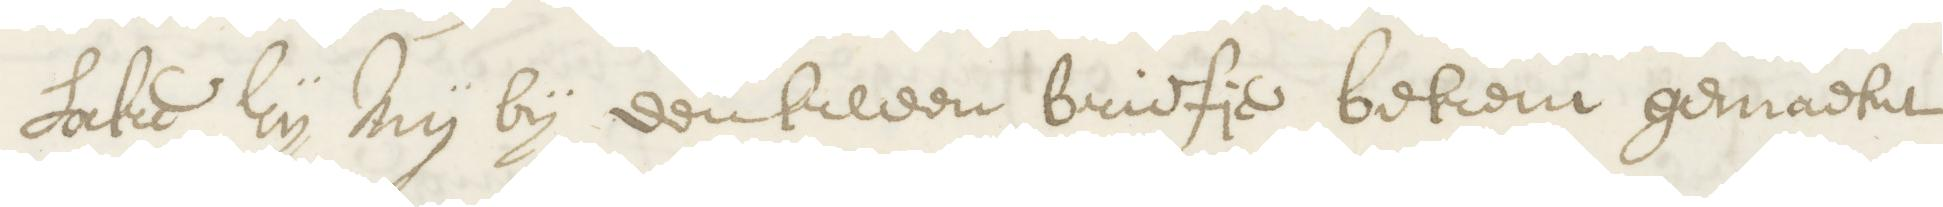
sake hij mij bij een kleen briefje bekent gemaekt
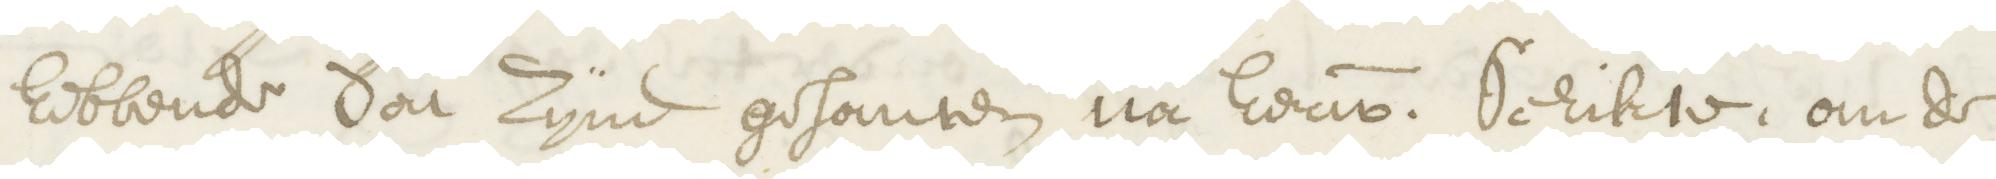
hebbende dat zijne gesanten na herw. schikte, om de
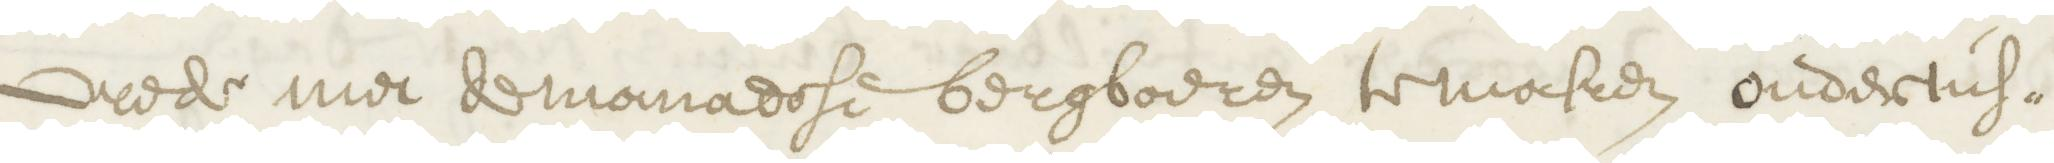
vrede met de manadose bergboeren temaken ondertus„
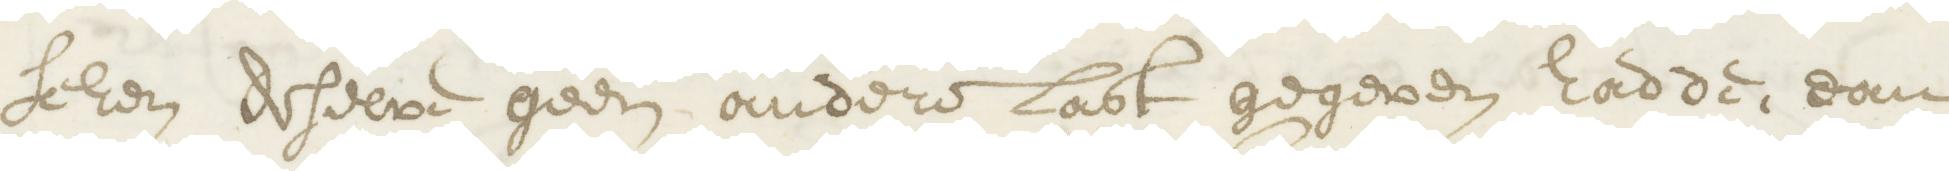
schen deselve geen andere last gegeven hadde, dan
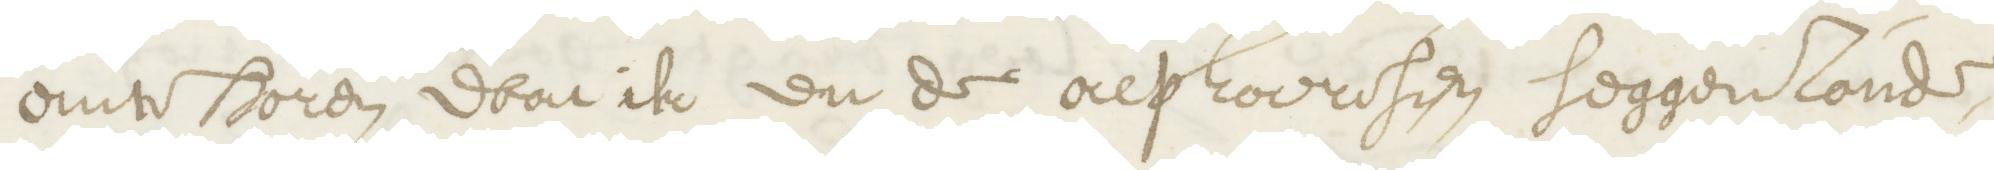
om te horen wat ik en de alphoeresen seggen zoude,
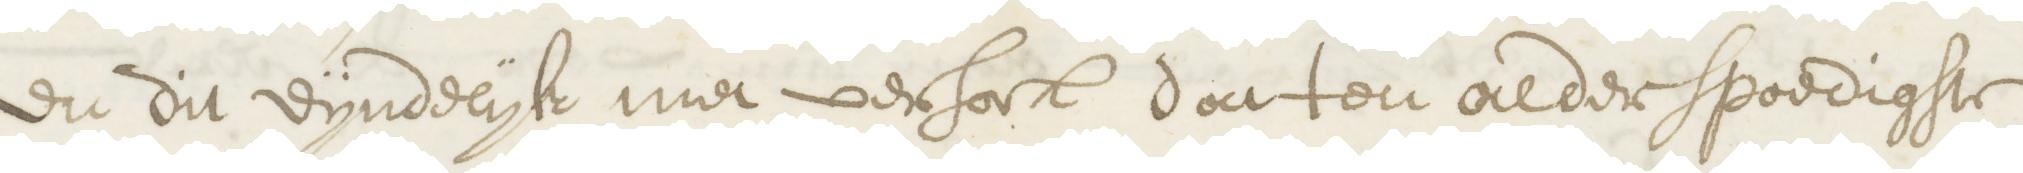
en dit eijndelijk met versoek dat ten alder spoedigste
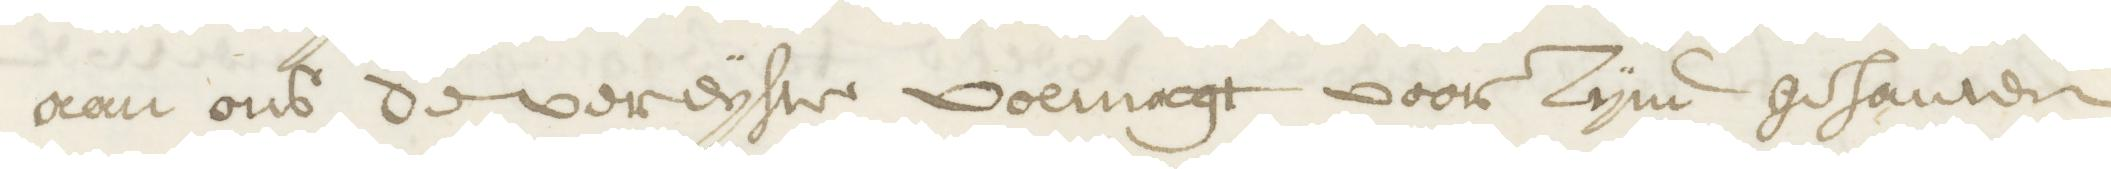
aan ons de vereijste volmagt voor zijne gesanten
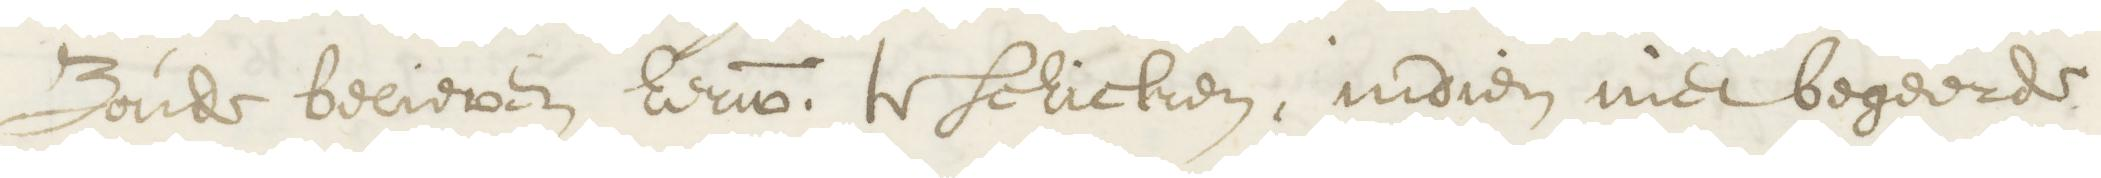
zoude believen herw: te schicken, indien niet begeerde
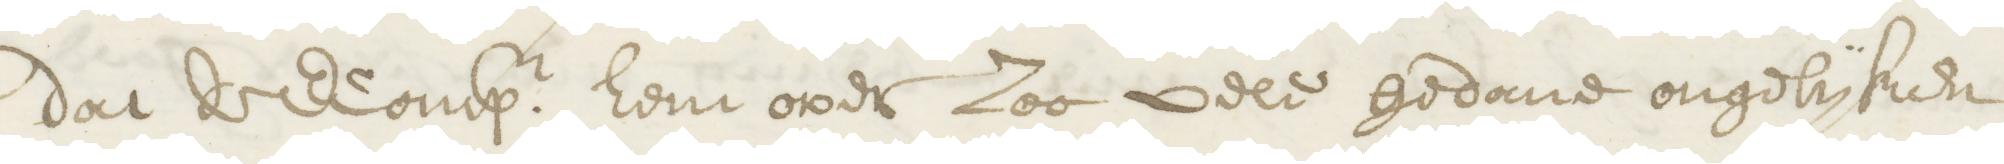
dat de EComp:s hem over zoo vele gedane ongelijken
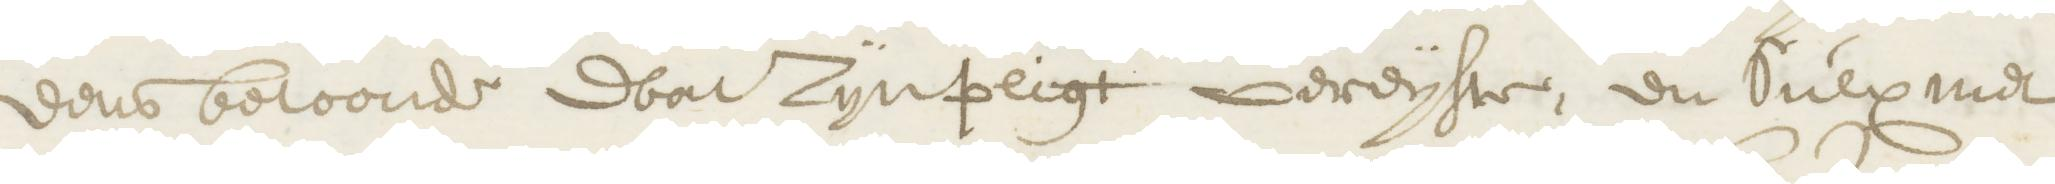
eens betoonde wat zijn pligt vereijste, en sulx niet
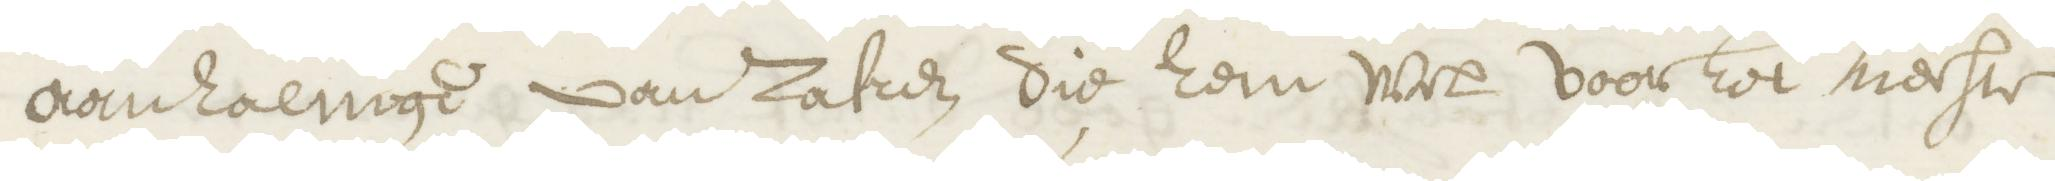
aanhalinge van zaken die hem wel voor het meeste
